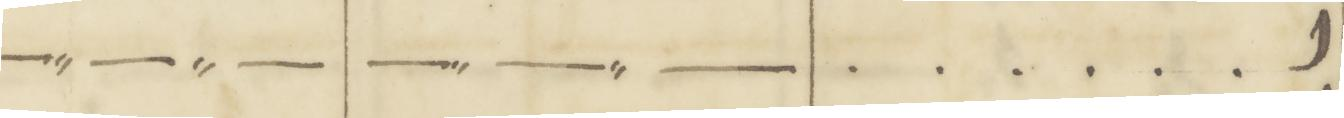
—„ —„ — —„ —„ — . . . . . . 1
